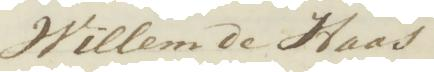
Willem de Haas
